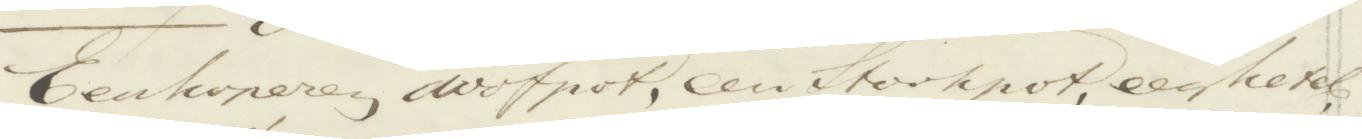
Een koperen doofpot, een stookpot, een ketel,
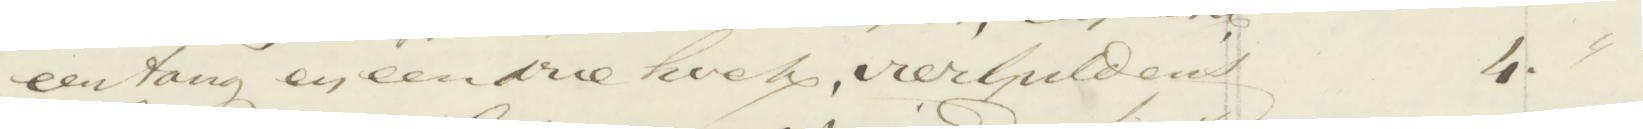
een tang en een driehoek, vier Guldens — 4.„
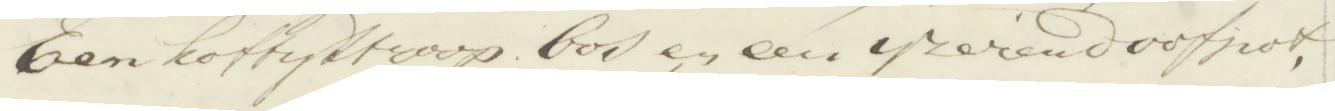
Een koffystroop bos en een yzeren doofpot,
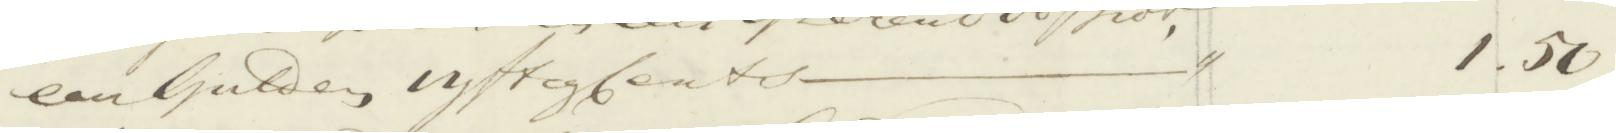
een Gulden vyftig Cents— 1.50
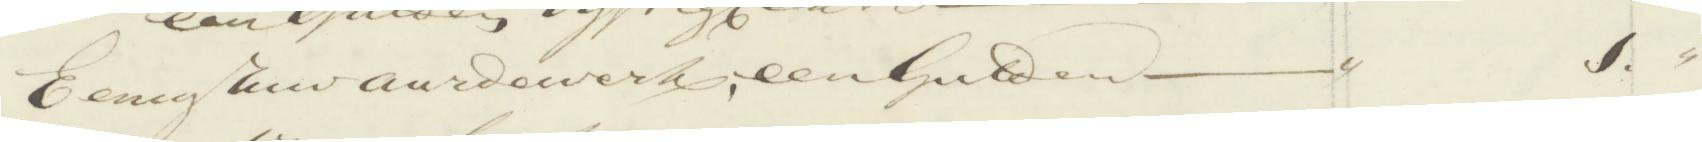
Eenig ruw aardewerk, een Gulden—„ 1. „
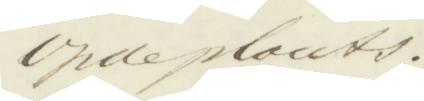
Op de plaats.
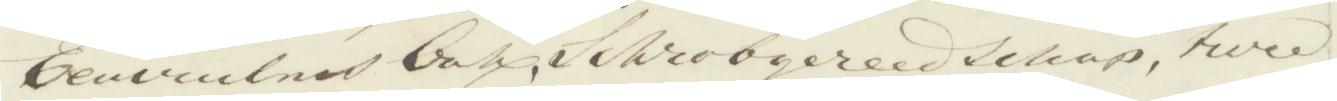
Een vuilnis bak, schrobgereedschap, twee
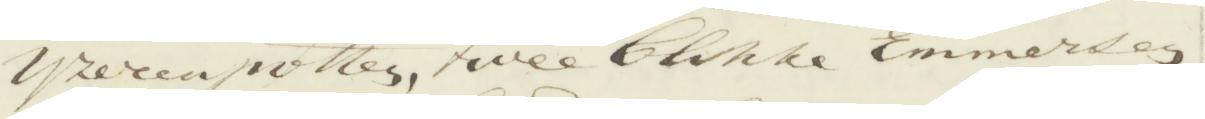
yzeren potten, twee blikke Emmers en
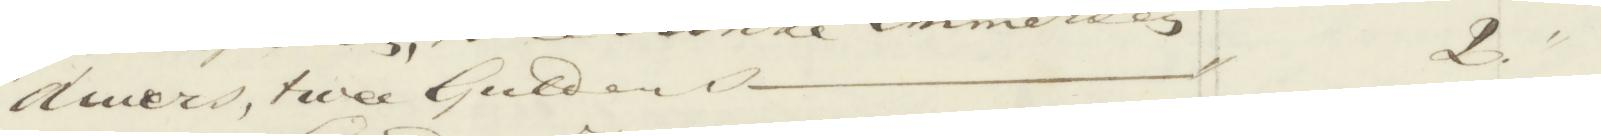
divers, twee Guldens—„ 2.„
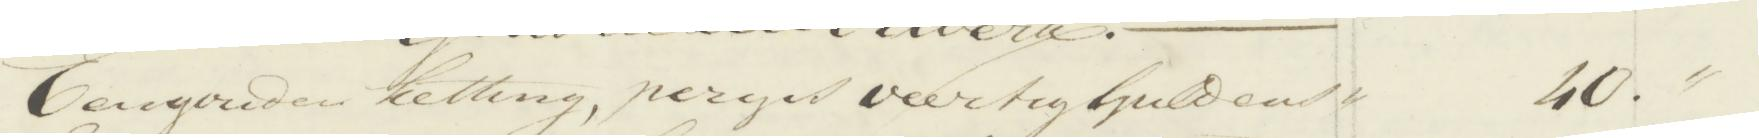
Een gouden ketting, per gis veertig Guldens„ 40.„
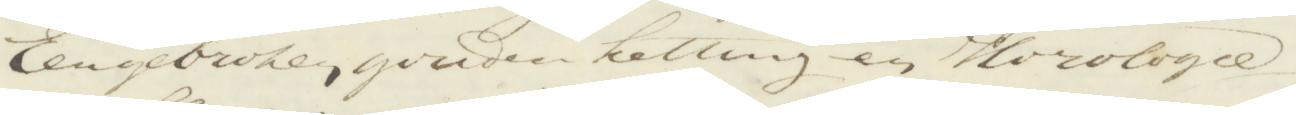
Een gebroken gouden ketting en Horologie
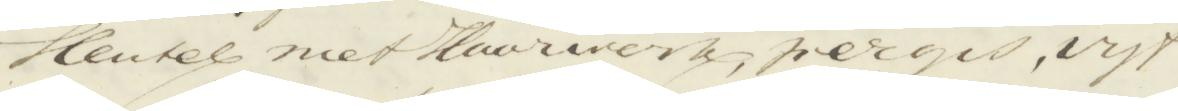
sleutel met Hoorwerk, per gis, vyf
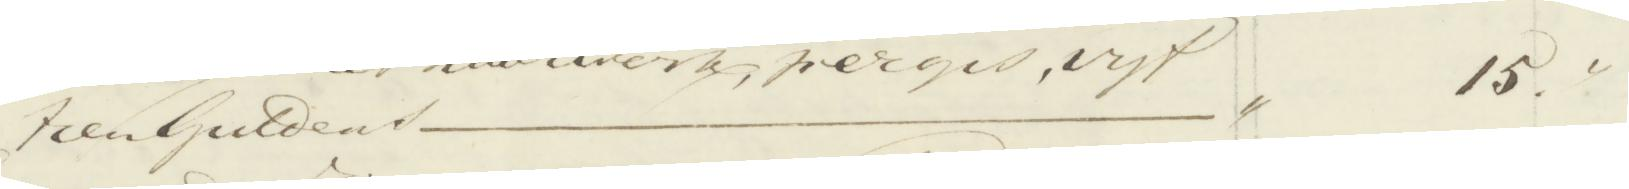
tien Guldens—„ 15.„
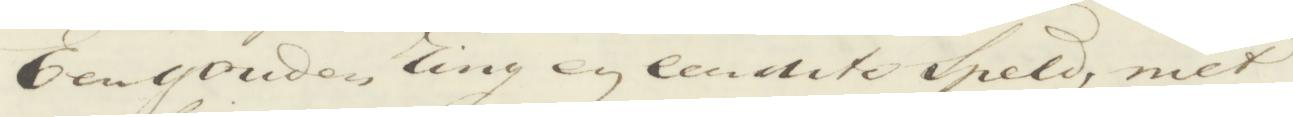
Een gouden ring en een dito speld, met
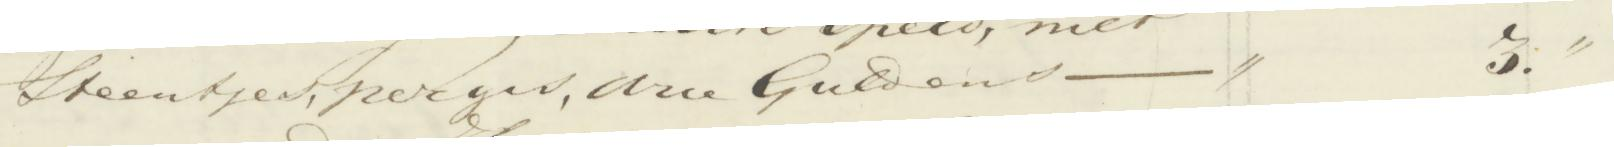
steentjes, per gis, drie Guldens—„ 3.„
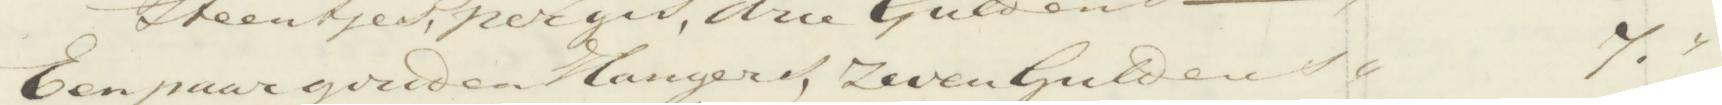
Een paar gouden Hangers, Zeven Guldens„ 7.„
